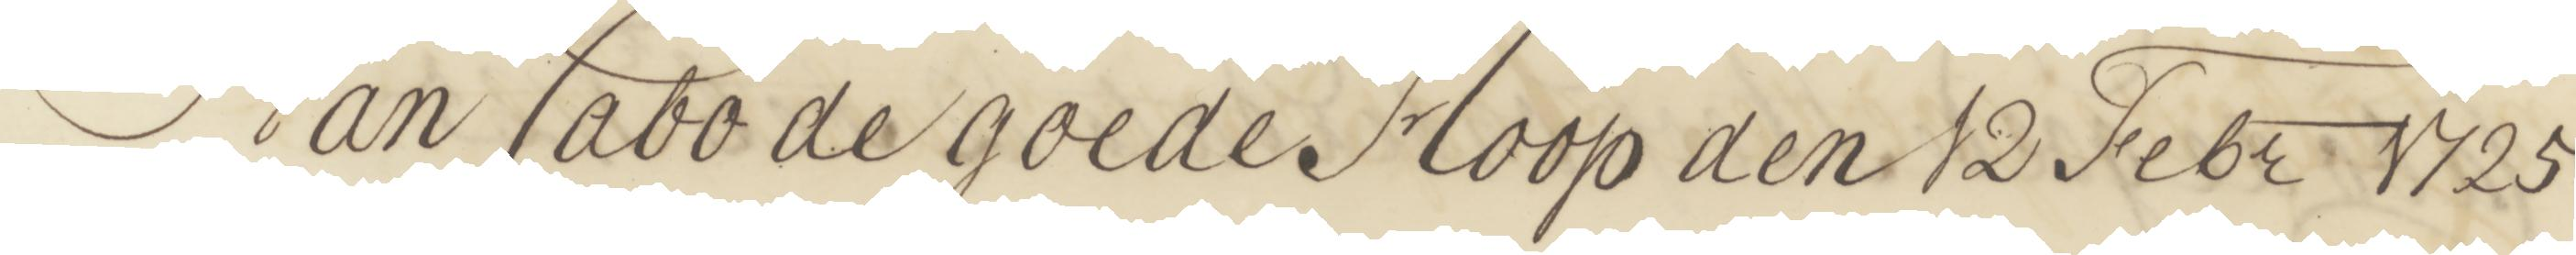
Van Cabo de goede Hoop den 12 Febr 1725
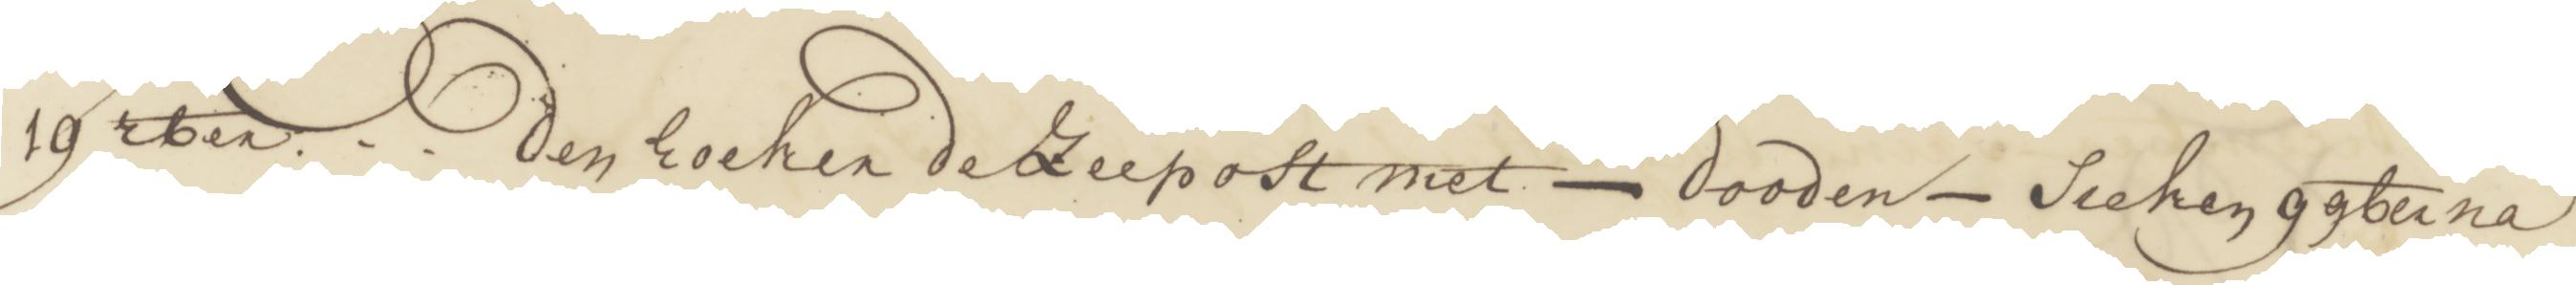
19 7ber: - - den hoeker de zeepost met. — dooden — sieken 9 9ber na
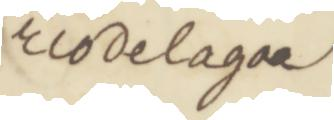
rio dela goa
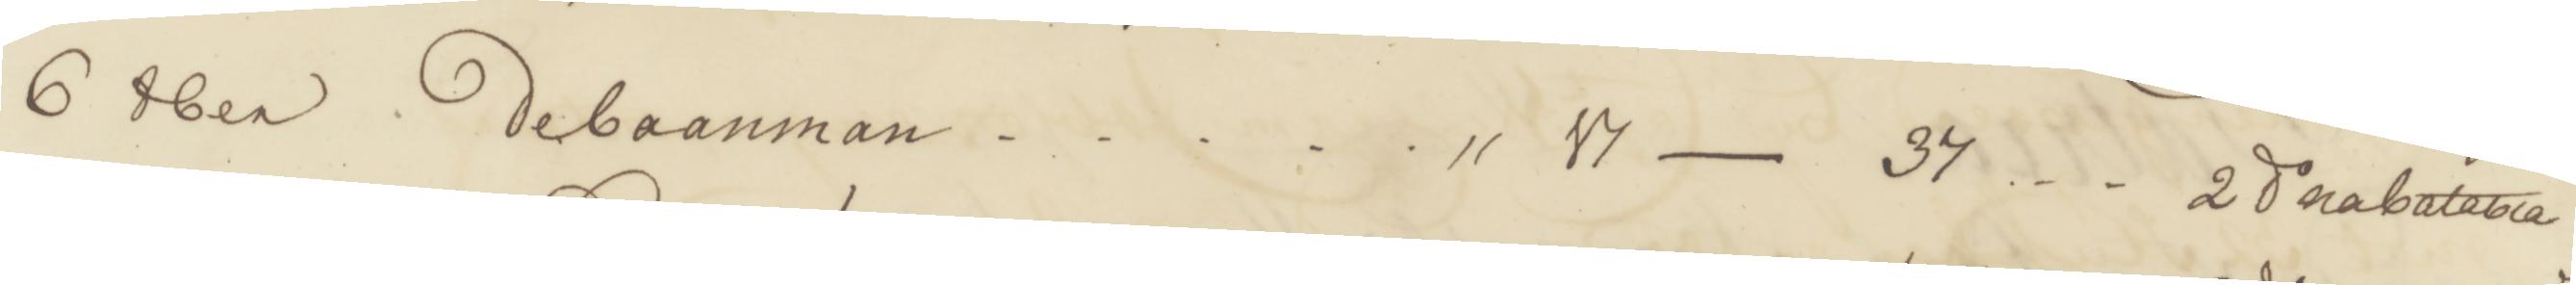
6 8ber de baanman - - - - . „ 17 — 37 . - - 2 do nabatavia
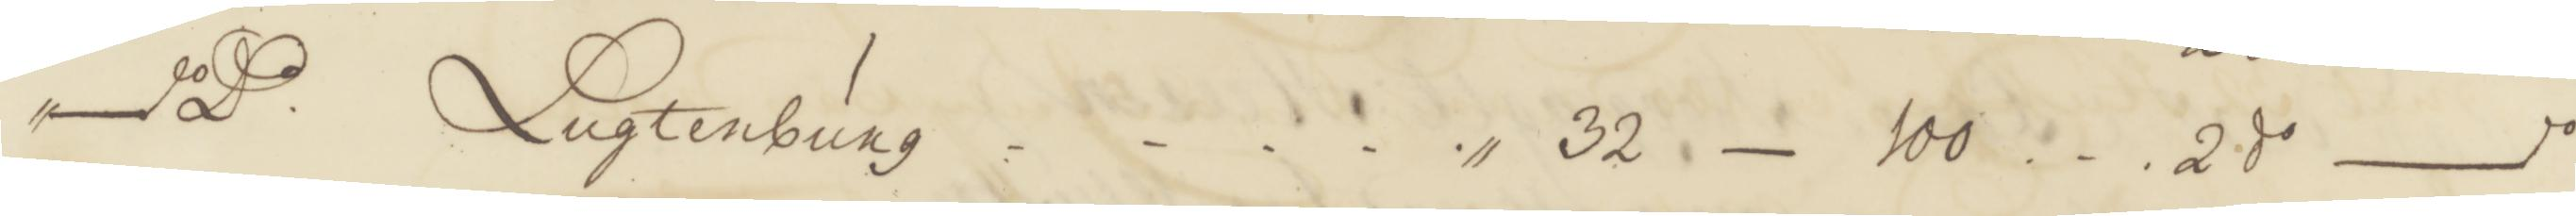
„ _o D.o Lugtenburg - - - - . „ 32 — 100 . - . 2. do _o
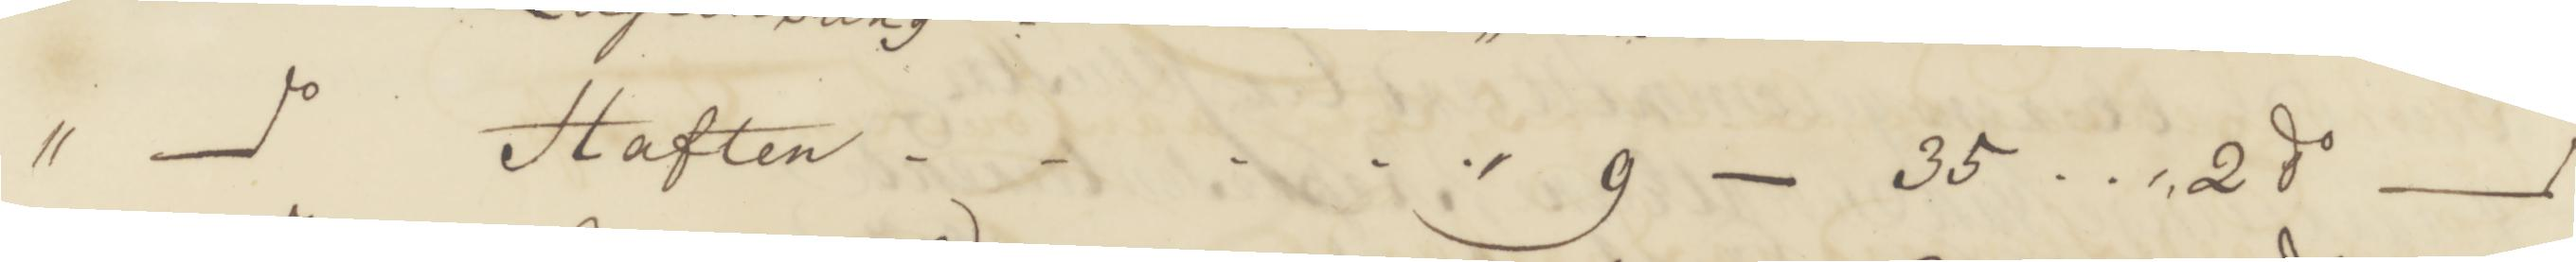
„ _o Haften - - - - . „ 9 — 35 . . „ 2 do _
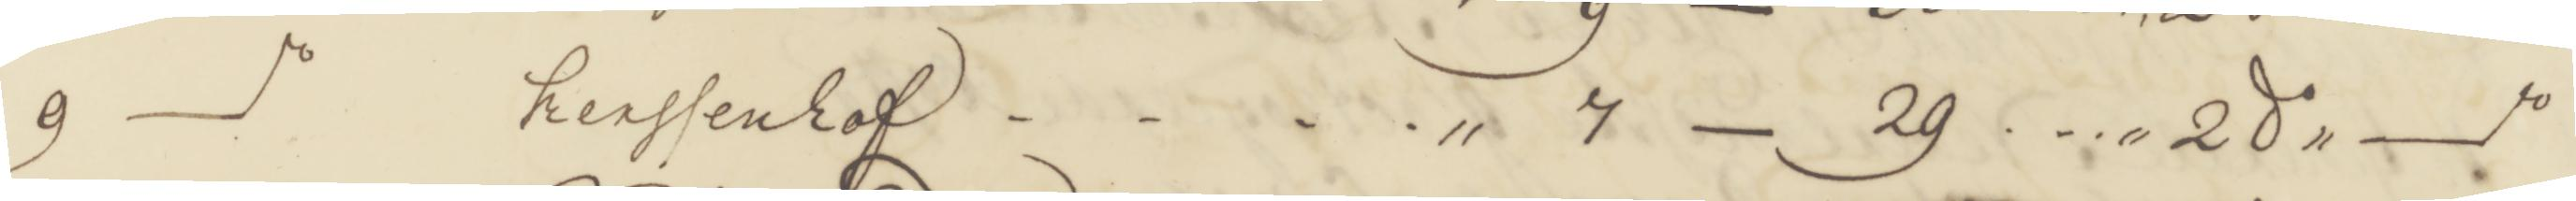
9 _o kerssenhof - - - . „ 7 — 29 . - . „ 2 d„o _o
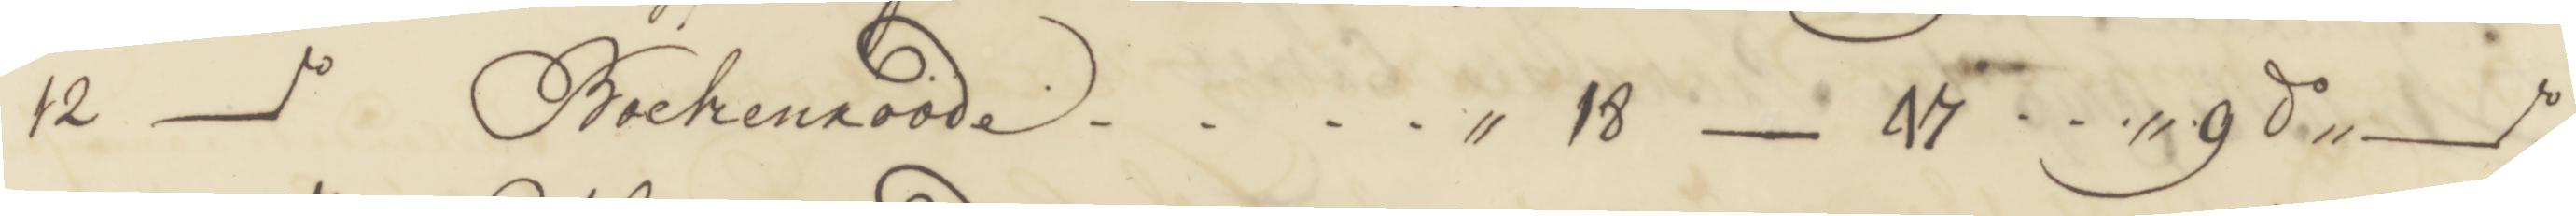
12 _o Boekenroode - - - - „ 18 — 47 - - . „ .9 d„o _o
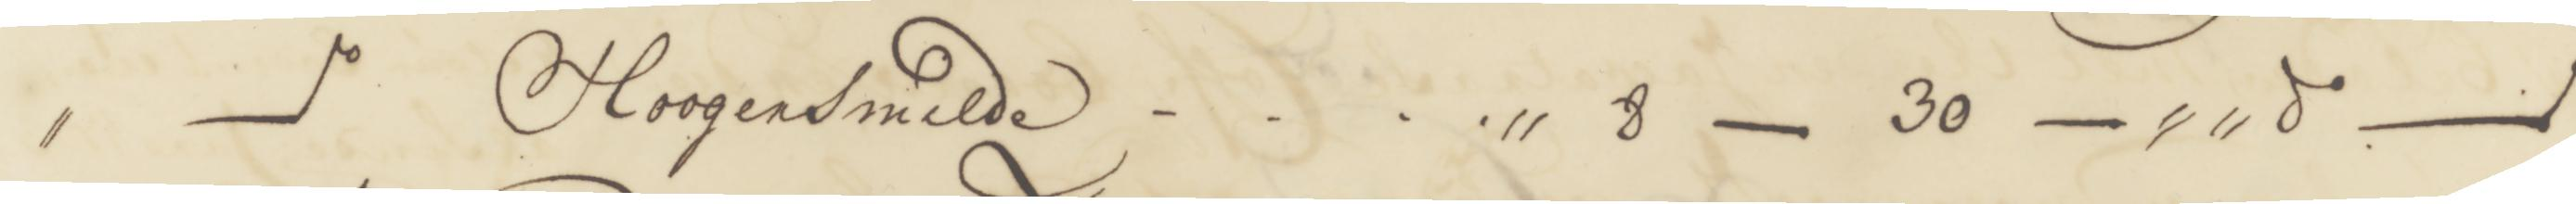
„ _o Hoogersmilde - - . . „ 8 — 30 — „ „ d„o _
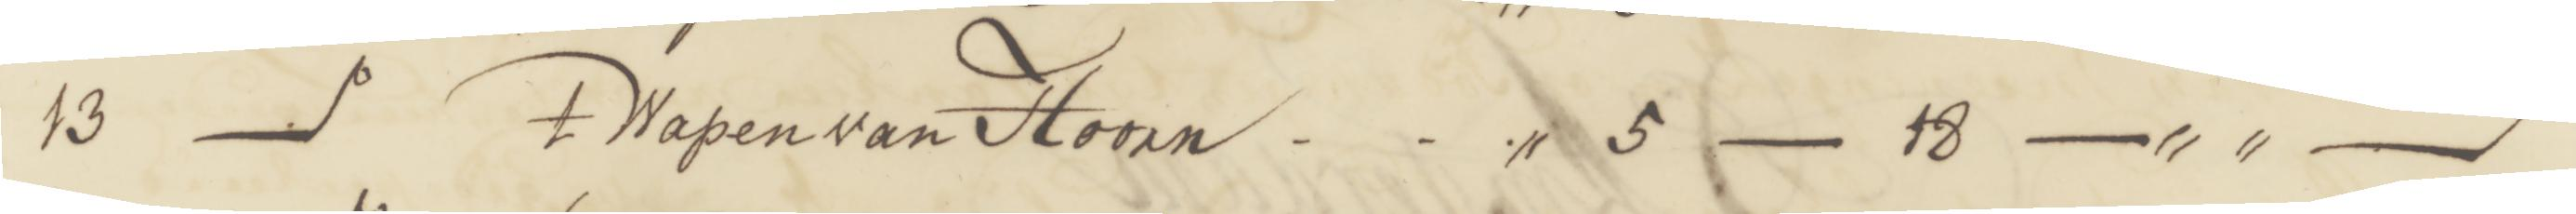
13 _o t wapen van Hoorn - - .„ 5 — 18 — „ „ _o
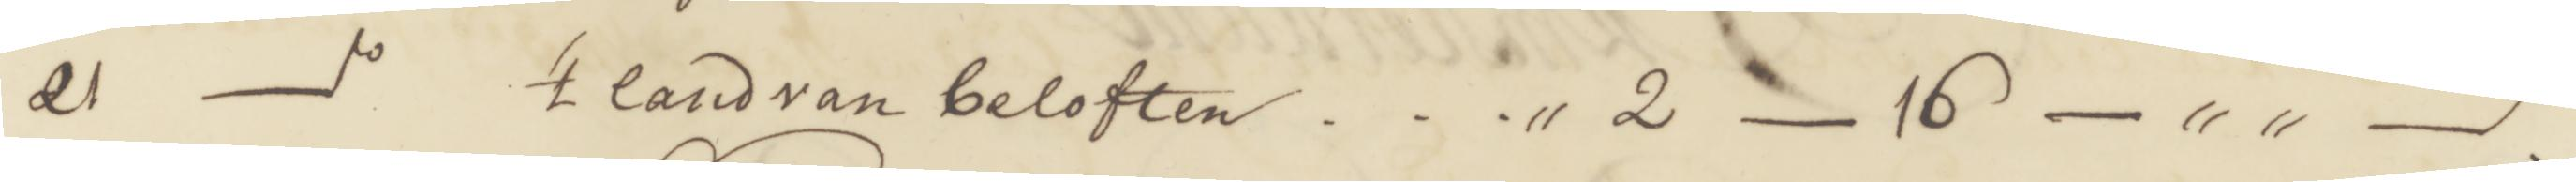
21 _o ’t land van beloften - - . „ 2 — 16 — „ „ _o
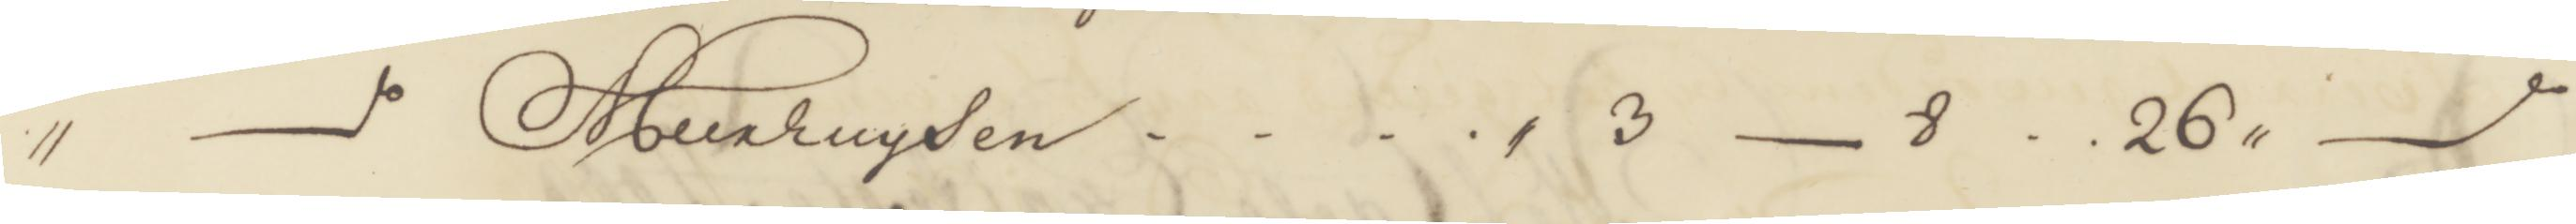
„ _o Meerhuysen - - - . „ 3 — 8 . . 26 „ _o
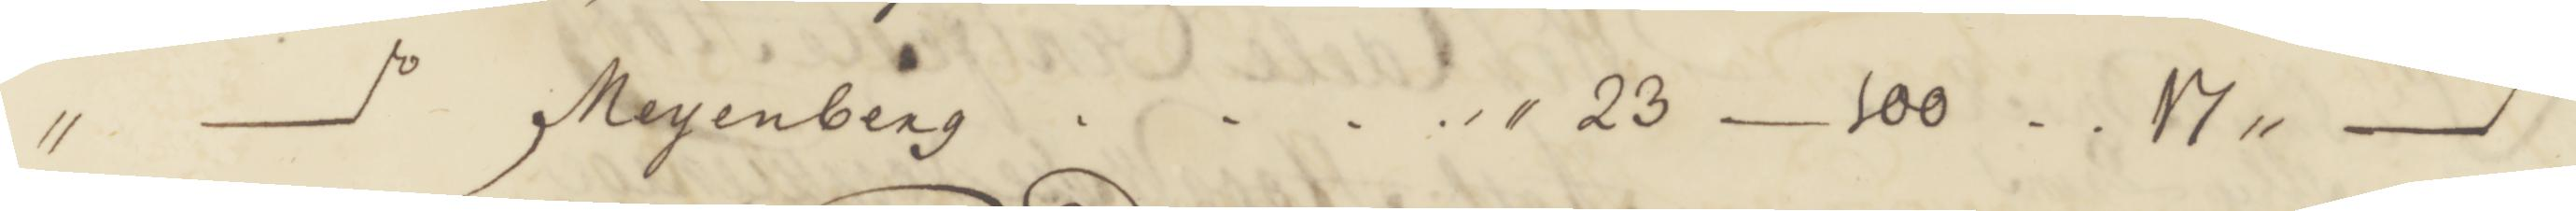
„ _o Meyenberg . . . . , „ 23 — 100 - . 17 „ _o
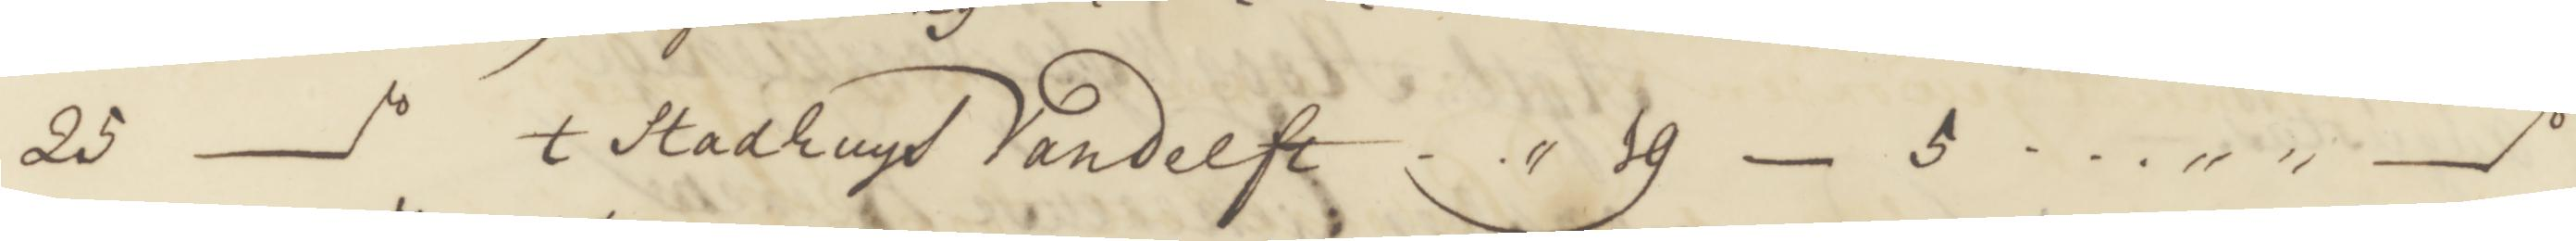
25 _o t stadhuys vandelft - . „ 19 — 5 - . . „ „ _o
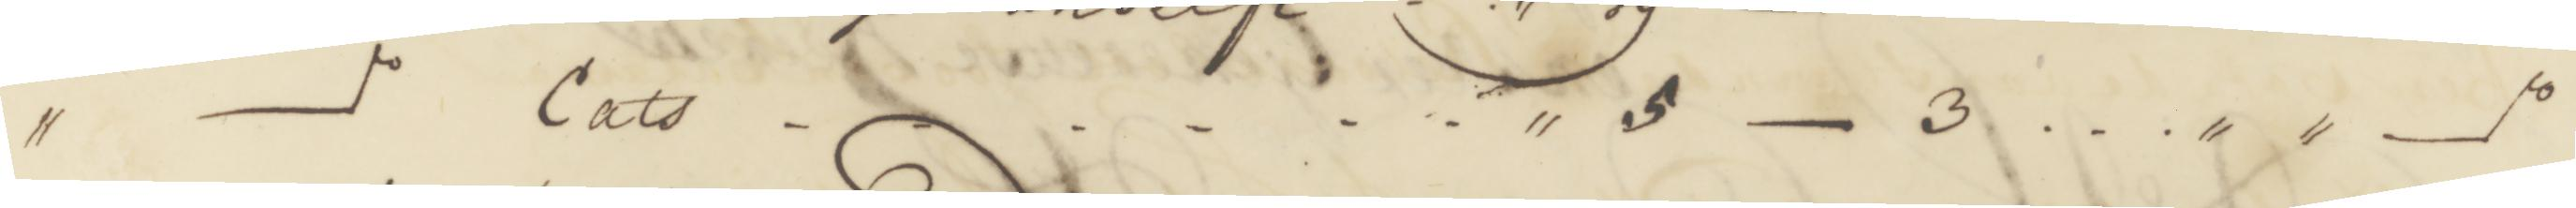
„ _o Cats - - - - - - „ 5 — 3 . - . „ „ _o
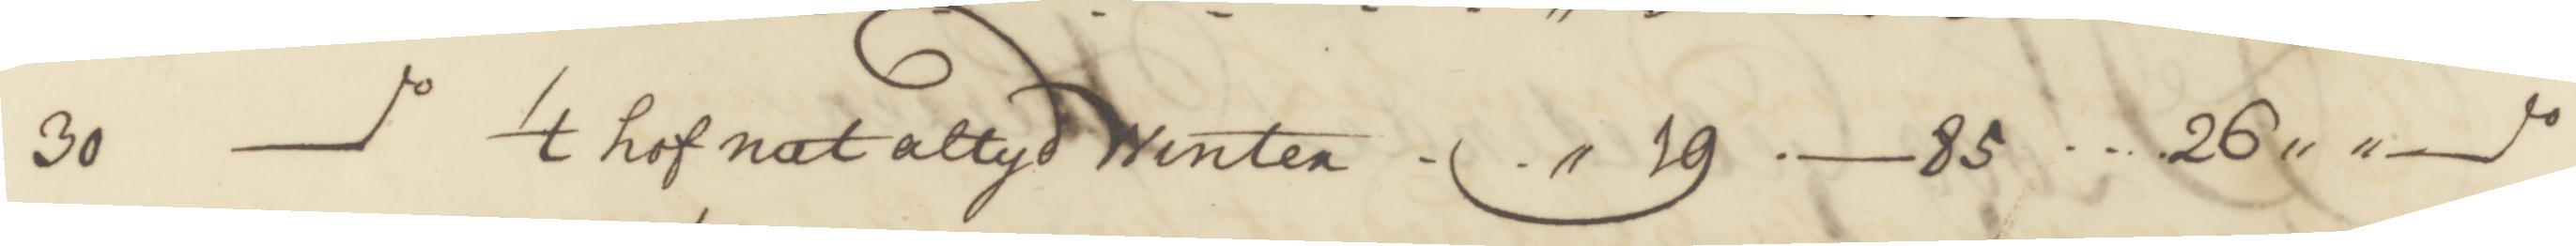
30 _o ’t hof niet altijd winter - . „ 19 . — 85 . . . . 26 „ „ _o
